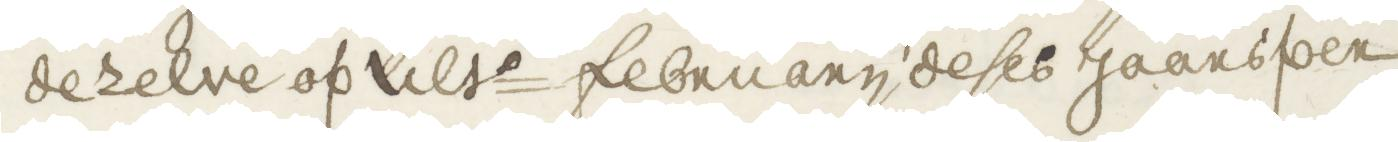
dezelve op ult=o februarij deses Jaars per
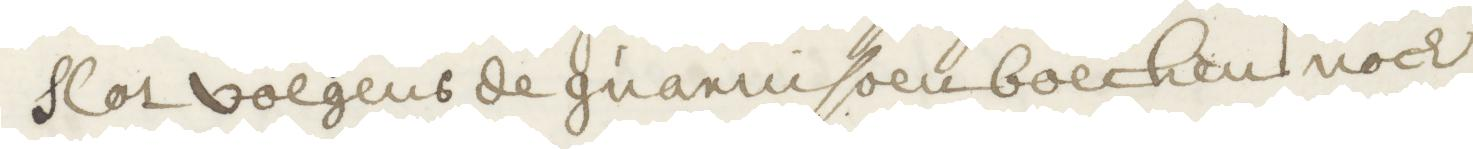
slot volgens de guarnisoen boecken noch
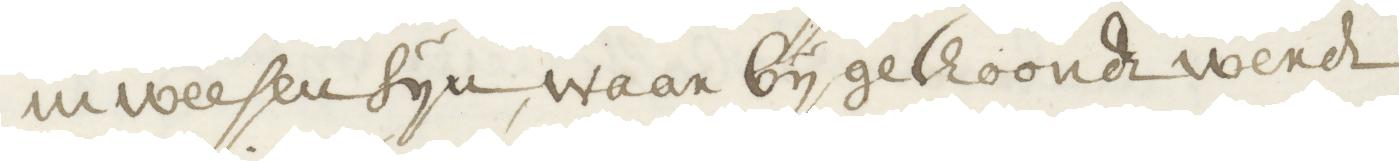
in weesen sijn, waar bij gethoondt werdt
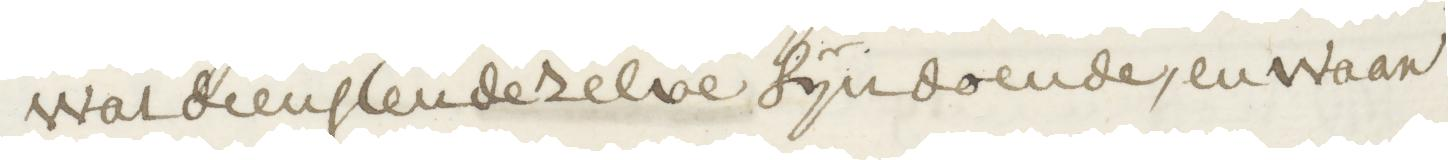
wat diensten dezelve sijn doende, en waar
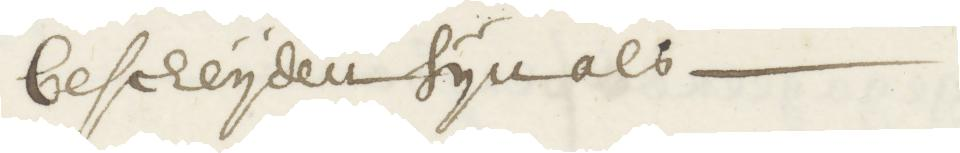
bescheijden sijn als —
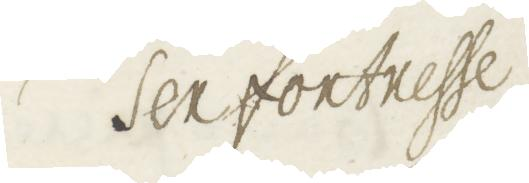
Ter fortresse
